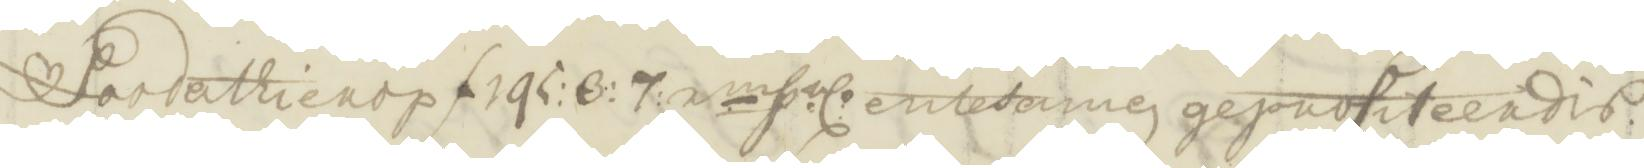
Soo dathierop ƒ 145: 3: 7: r=m p:r C:o entesamen geprofiteerdis
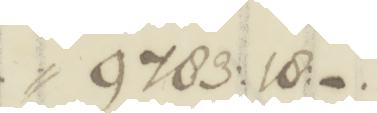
„ 9783: 18: -
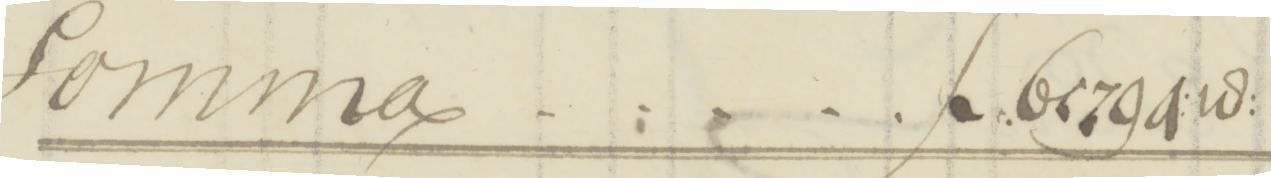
Somma - : - - . ƒ.65794:18:
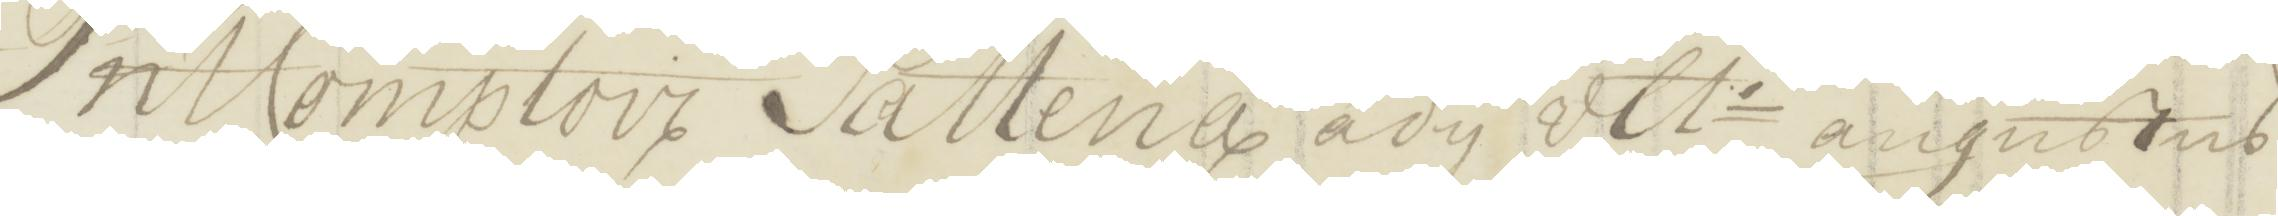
In't Comptoir Pattena adij ult=o augustus
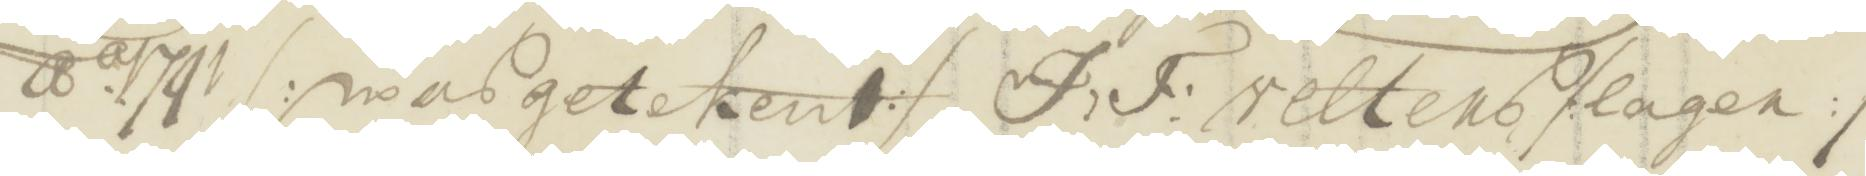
A:o 1741 /:was getekent:/ I: F: velters /:lager:/
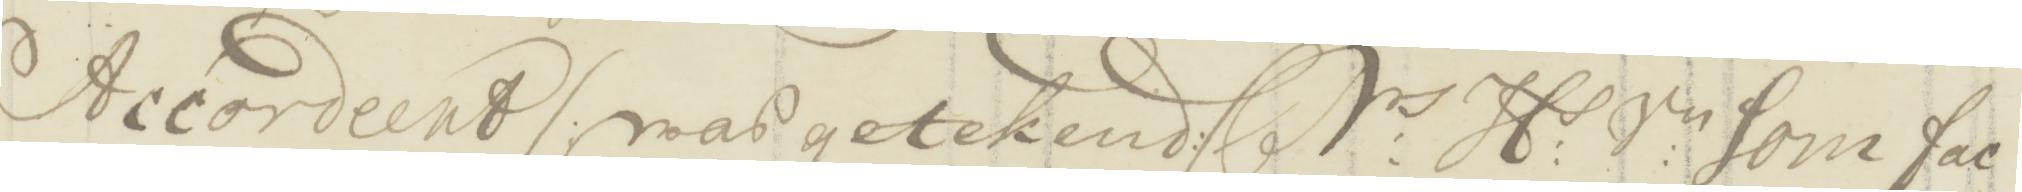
Accordeert /:was getekend:/ V:s H:s V:n som fac
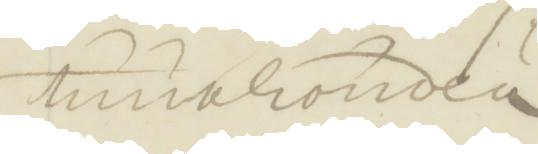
tuurhouder
